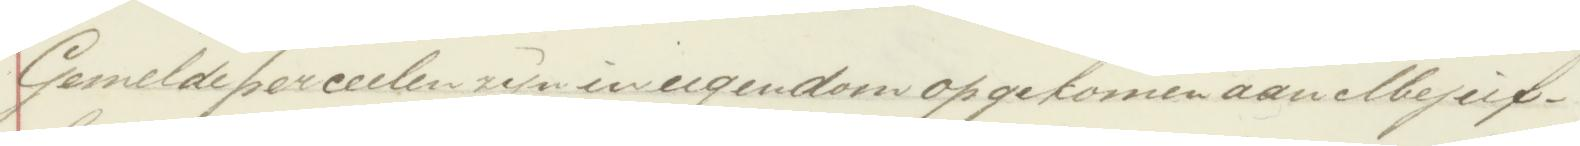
Gemelde perceelen zijn in eigendom opgekomen aan Mejuf-
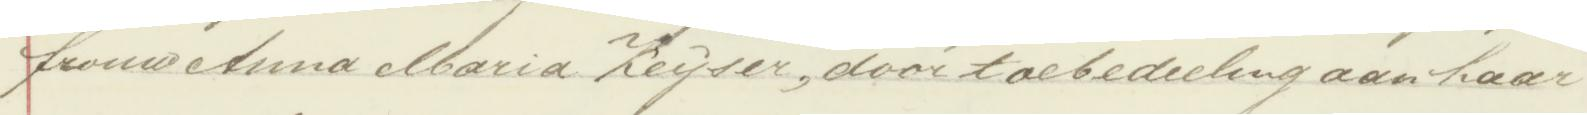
frouw Anna Maria Keijser, door toebedeeling aan haar
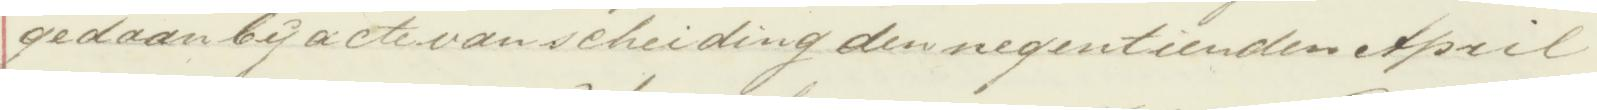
gedaan bij acte van scheiding den negentienden April
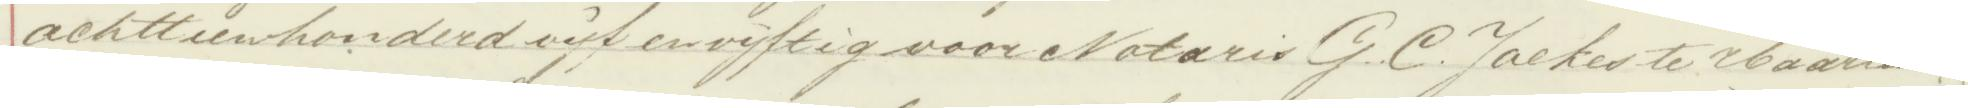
achttienhonderd vijf en vijftig voor Notaris G. C. Jaekes te Haarlem
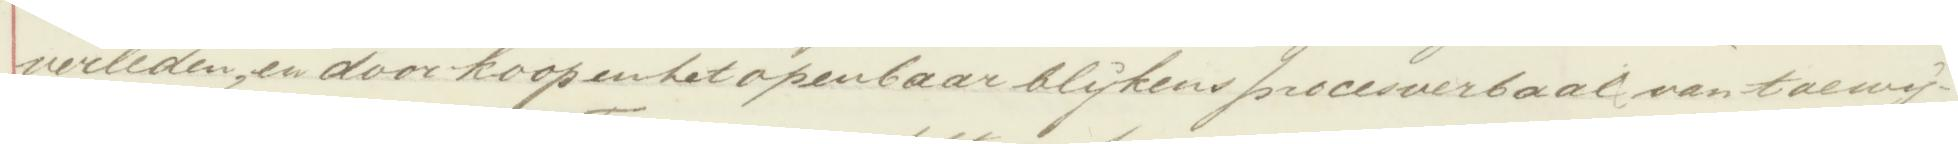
verleden, en door koop in het openbaar blijkens procesverbaal van toewij
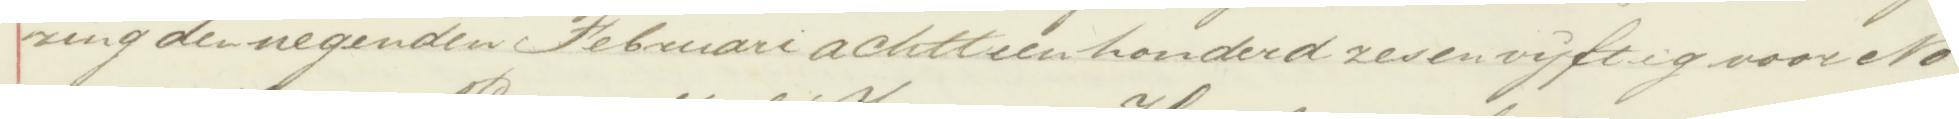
zing den negenden Februari achttien honderd zes en vijftig voor No
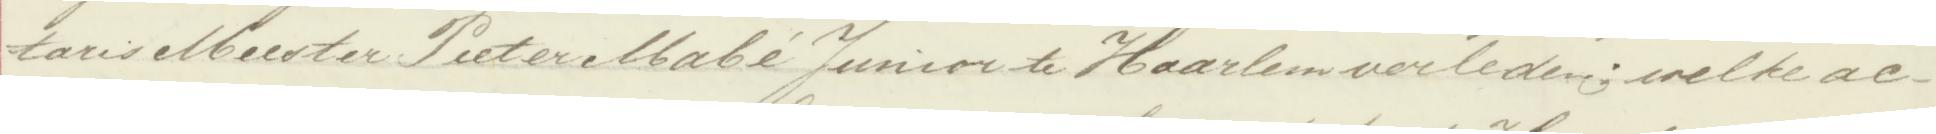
taris Meester Pieter Mabé Junior te Haarlem verleden; welke ac-
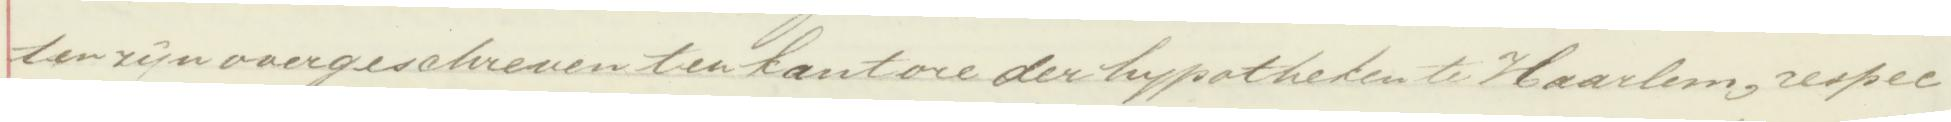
ten zijn overgeschreven ten kantore der hypotheken te Haarlem, respec
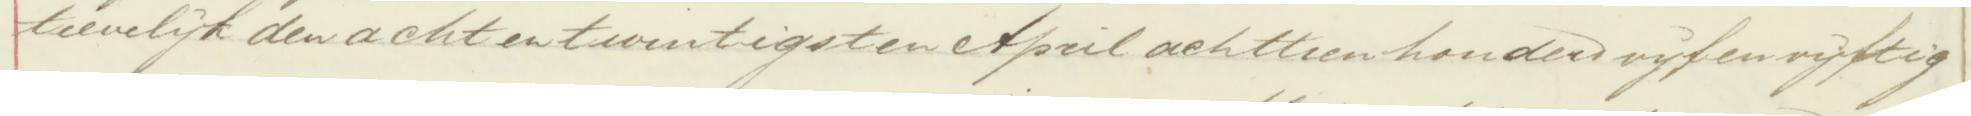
tievelijk den acht en twintigsten April achttien honderd vijf en vijftig
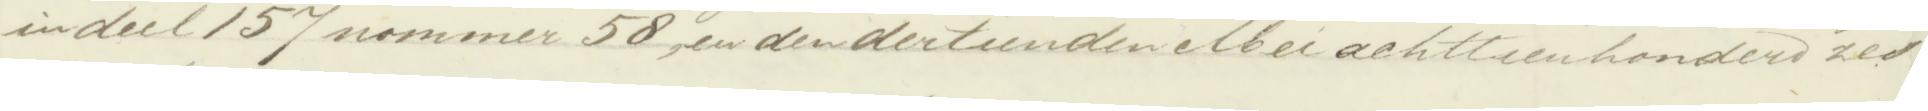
in deel 157 nommer 58, en den dertienden Mei achttienhonderd zes
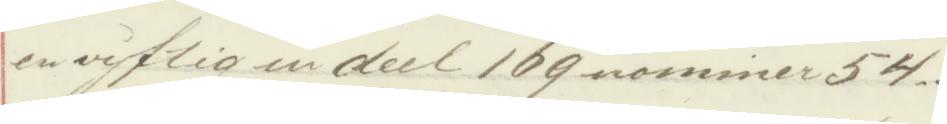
en vijftig in deel 169 nommer 54.
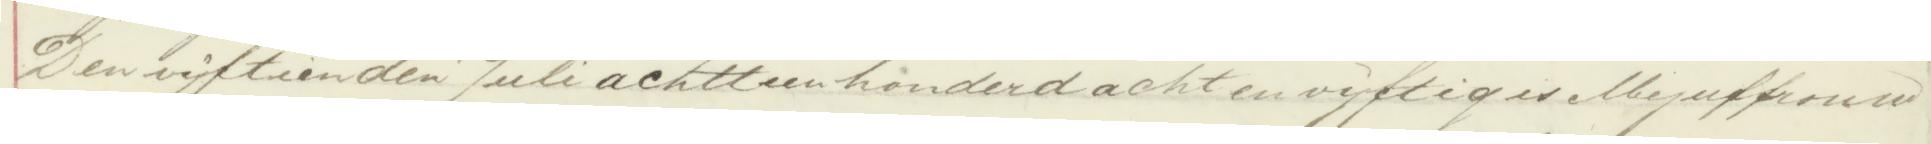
Den vijftienden Juli achttien honderd acht en vijftig is Mejuffrouw
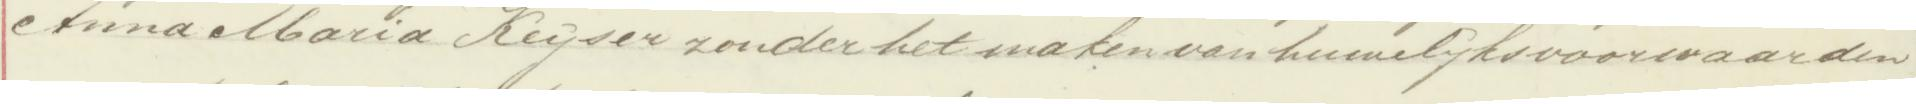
Anna Maria Keijser zonder het maken van huwelijksvoorwaarden
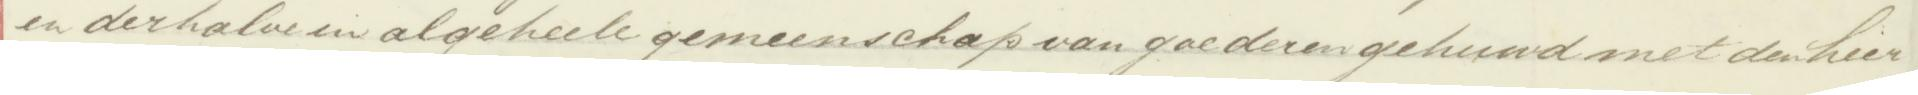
en derhalve in algeheele gemeenschap van goederen gehuwd met den heer
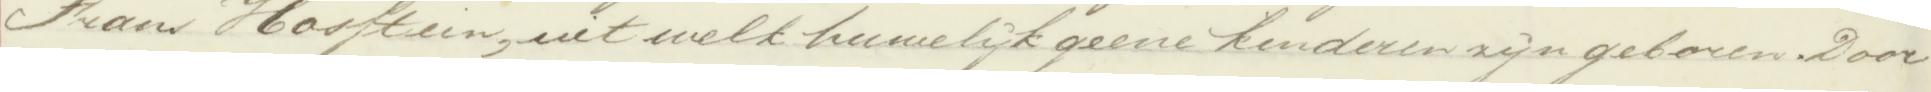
Frans Hosstein, uit welk huwelijk geene kinderen zijn geboren. Door
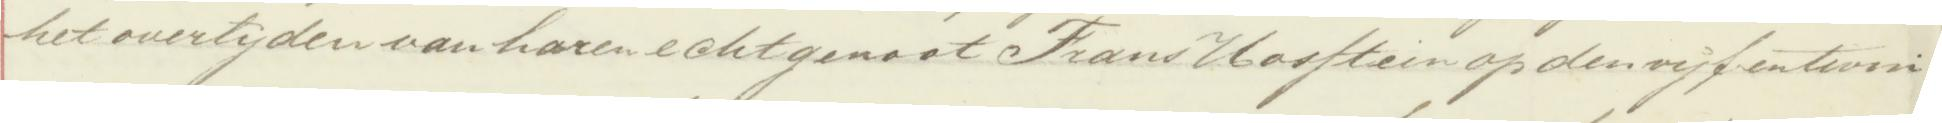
het overlijden van haren echtgenoot Frans Hosstein op den vijf en twin
